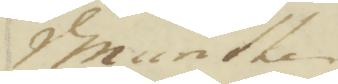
V munster
